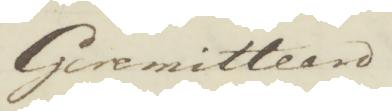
Geremitteerd
